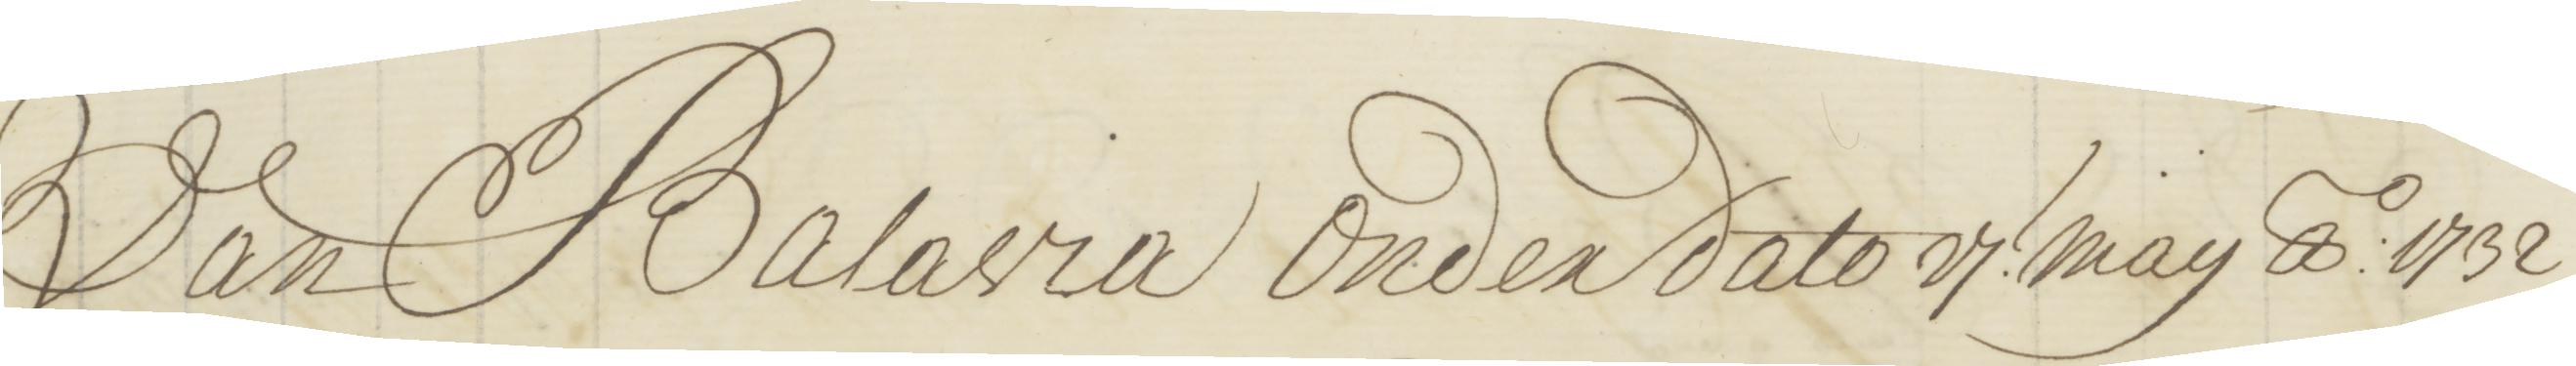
Van Batavia Onder dato 27:' may a:o 1732
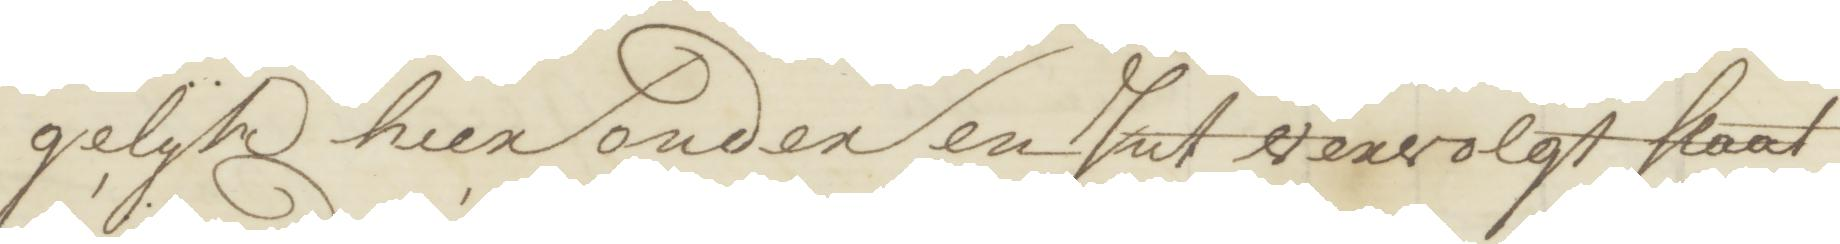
gelijk hier onder en Jnt vervolgt staat
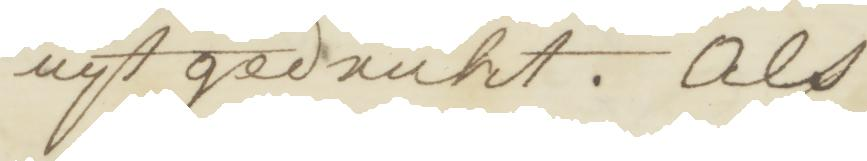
uijt gedrukt. Als
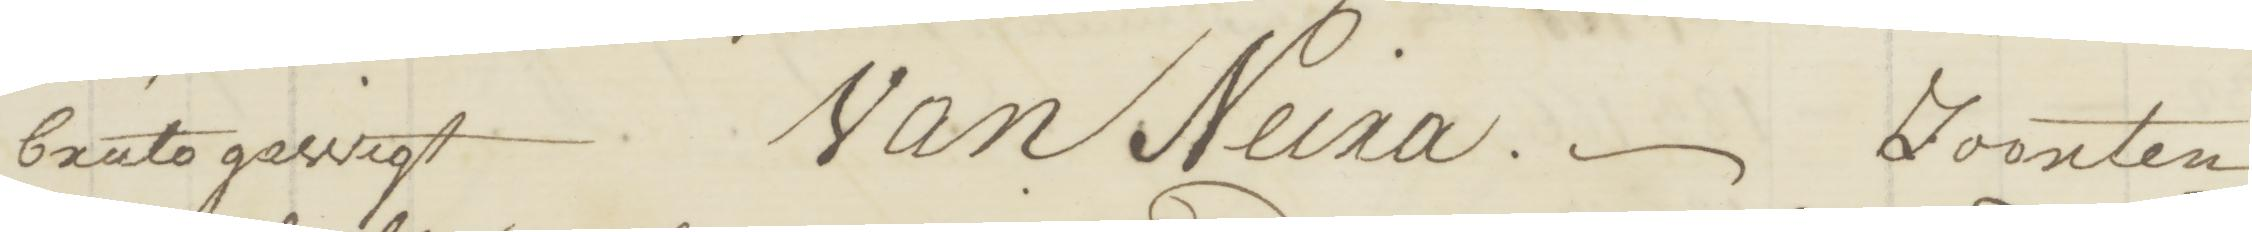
bruto gewigt van Neira.— Zoorten
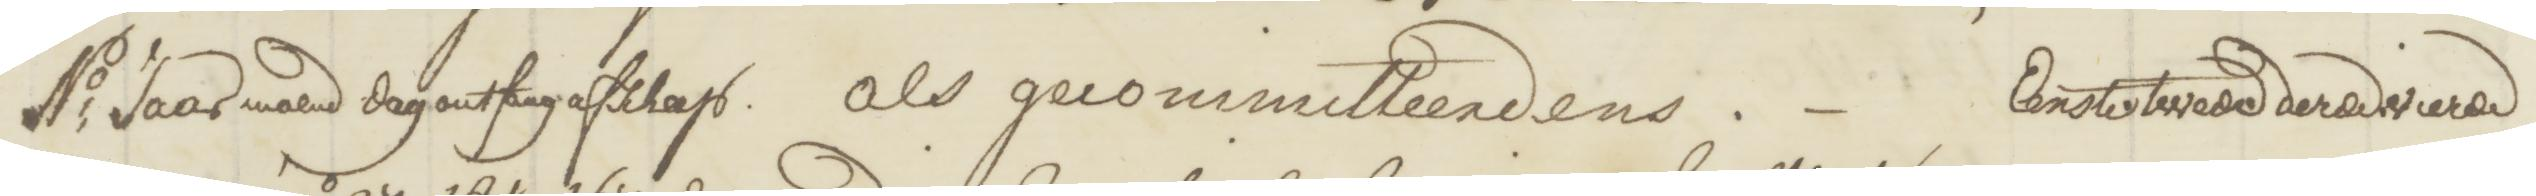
N„o Jaar maend dag ontfang afschap. als gecommitteerdens. — Eenste twede derde vierde
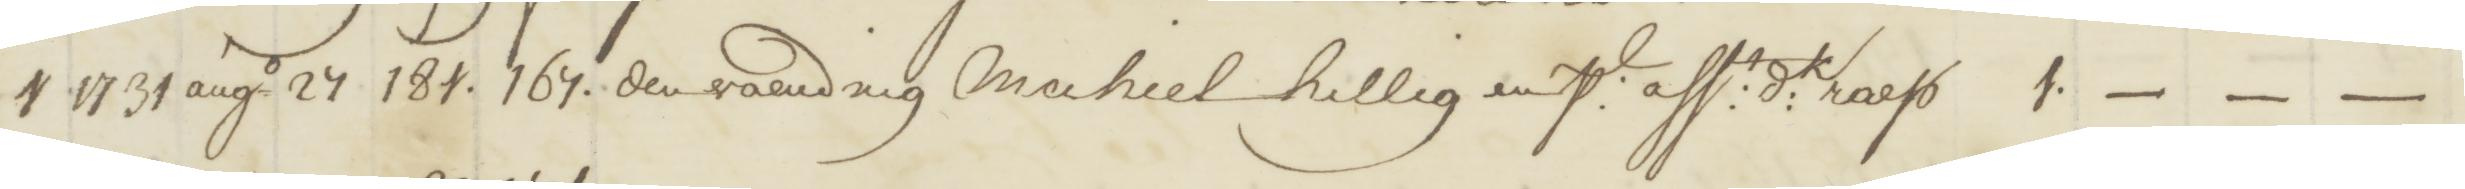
1. 1731 aug:o 27 181: 167. den vaendrig mahiel hillig en p:l ass:t d:k raep 1. — — —
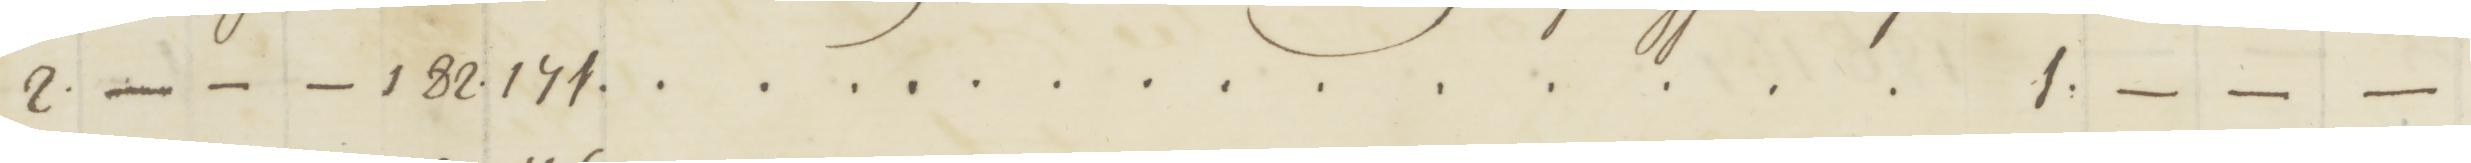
2. — — — 182.171. . . . . . . . . . . . . . . 1. — — —
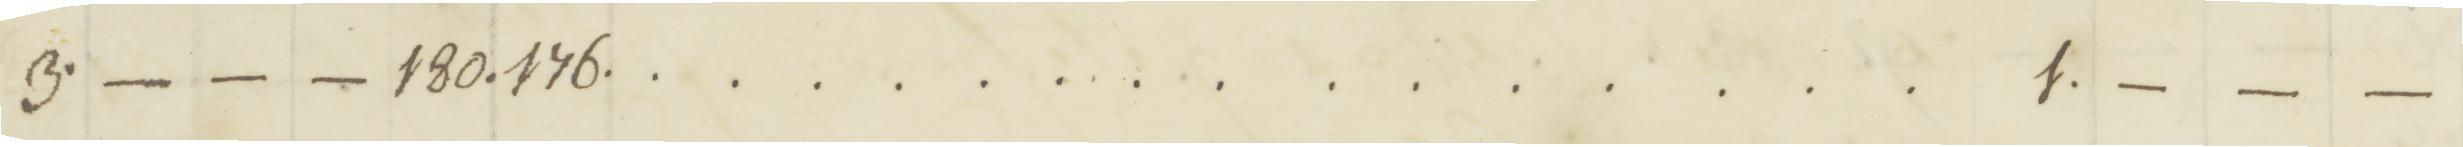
3: — — — 180.176 . . . . . . . . . . . . . . 1. — — —
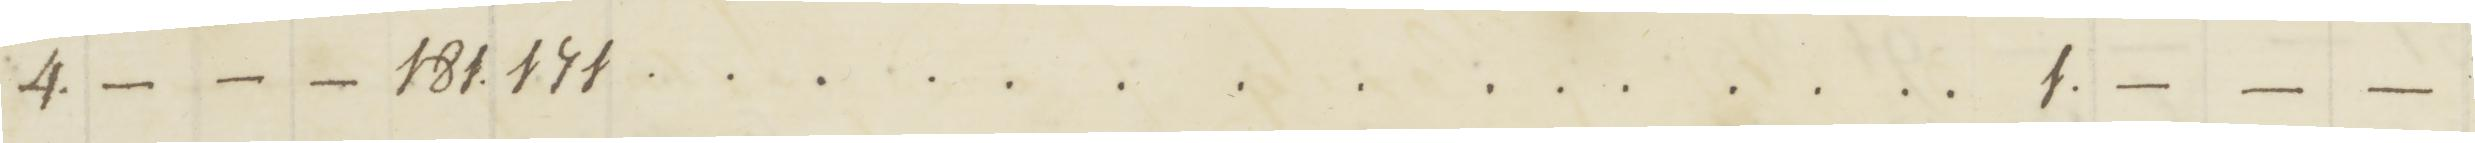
4. — — — 181.171 . . . . . . . . . . . . . . . . 1. — — —
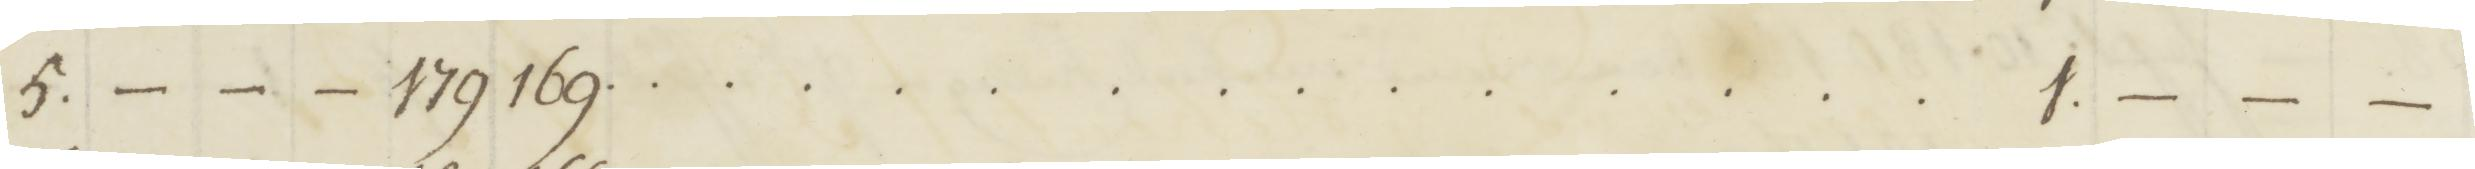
5. — — — 179 169 . . . . . . . . . . . . . . . . 1. — — —
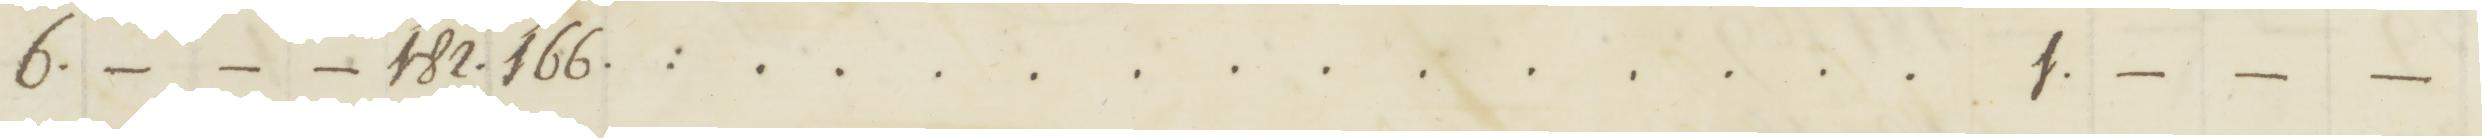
6. — — — 182.166. . : . . . . . . . . . . . . . . 1. — — —
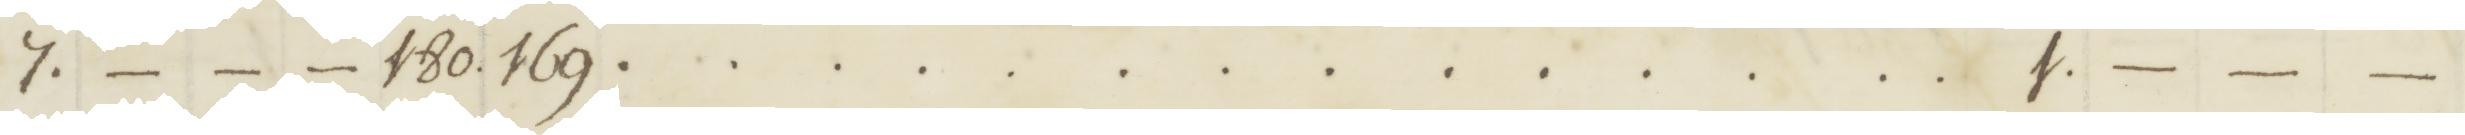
7. — — — 180. 169 . . . . . . . . . . . . . . . . 1. — — —
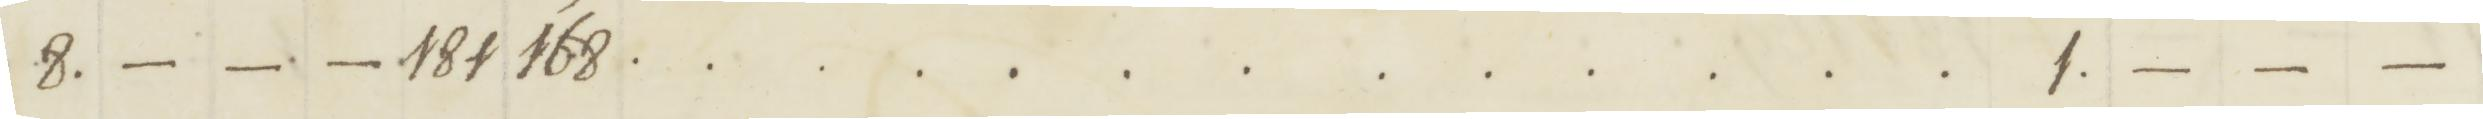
8. — — — 181 168 . . . . . . . . . . . . . . . . . 1. — — —
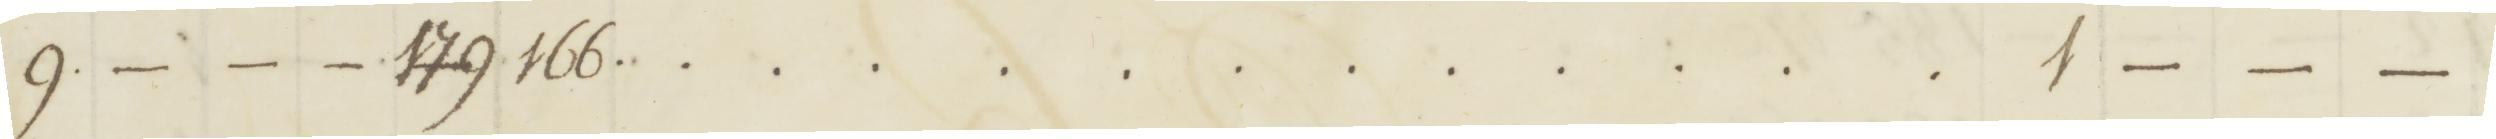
9. — — — 179 166 . . . . . . . . . . . . .1 — — —
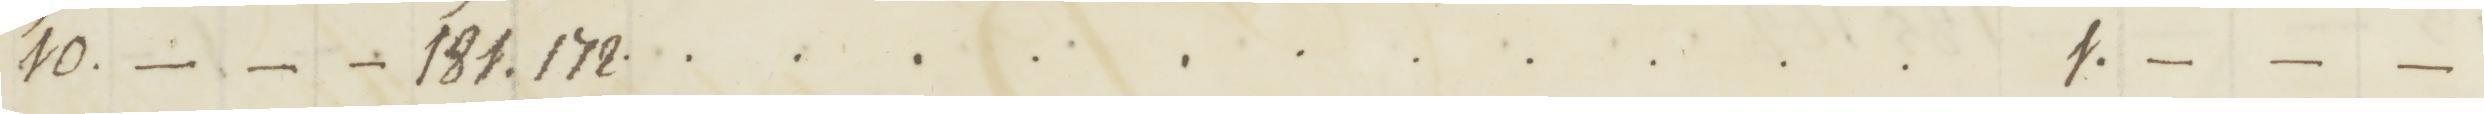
10. — — — 181. 172 . . . . . . . . . . . . . 1. — — —
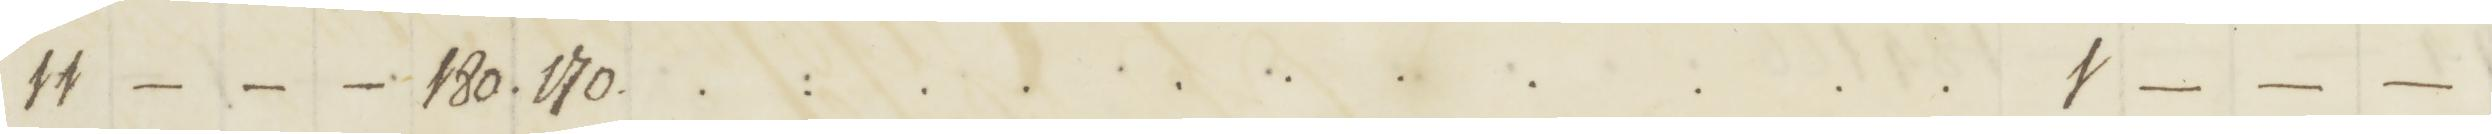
11 — — — 180. 170. . . . . . . . . . . . . . 1 — — —
